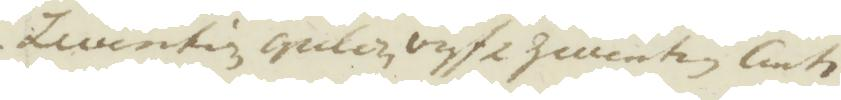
Zeventien gulden vyf en zeventig Cents
